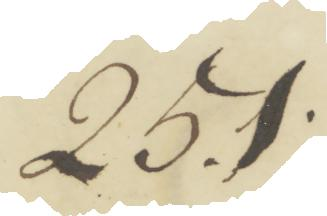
25.1:
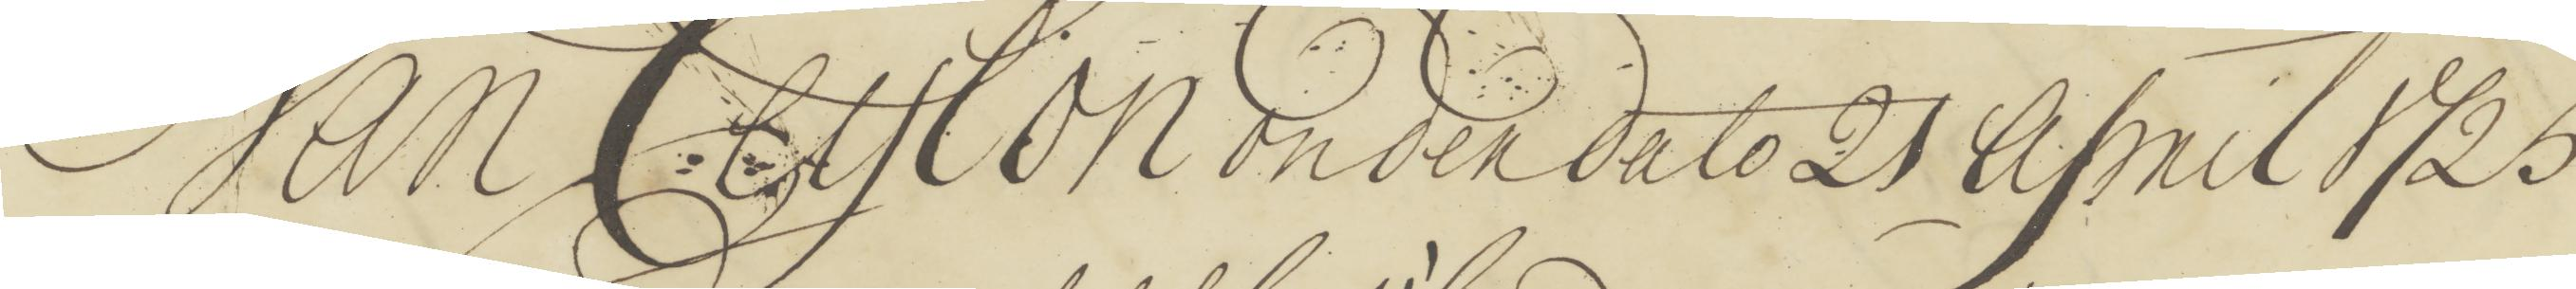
Van Ceylon onder dato 21 April 1725
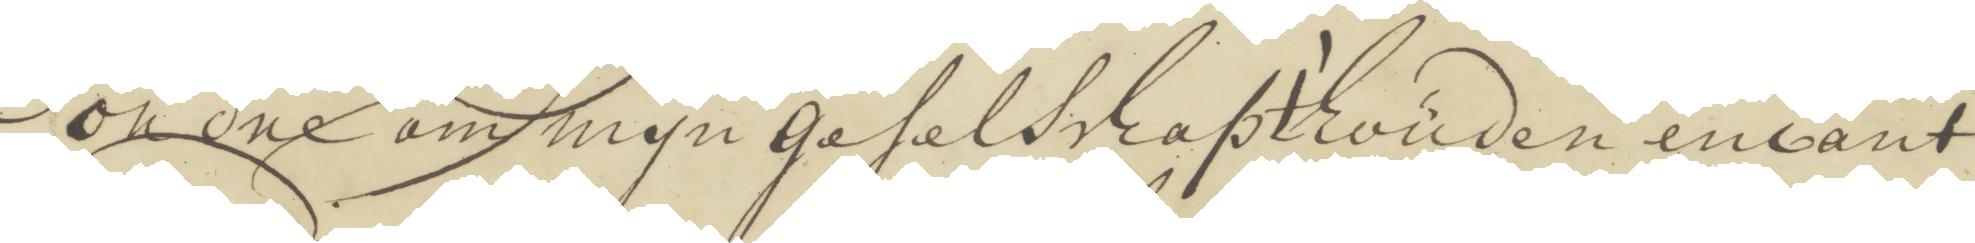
ordre om mijn geselschap t'houden en van’t
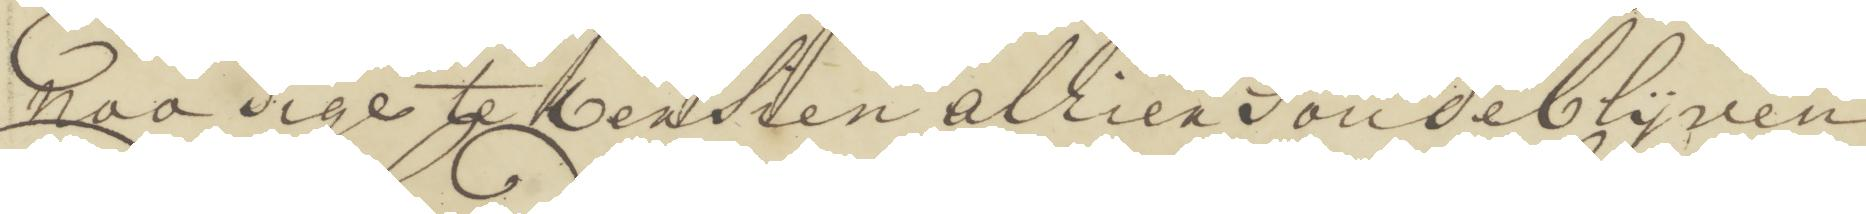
noodige te versien alhier soude blijven
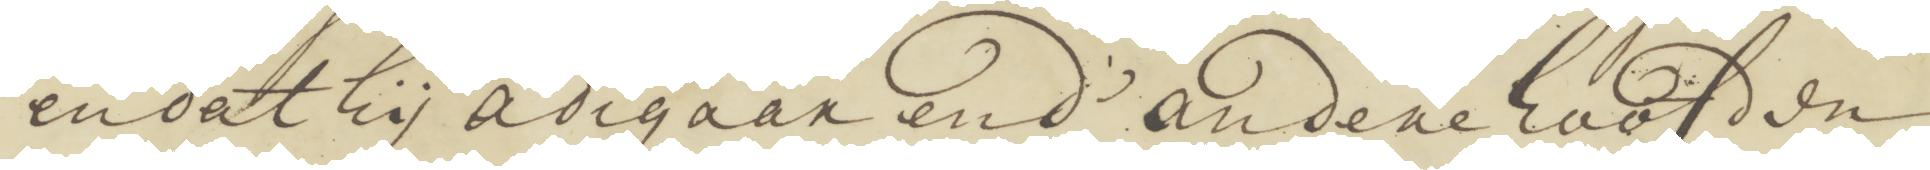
en dat hij adigaar en d’ andere hoofden
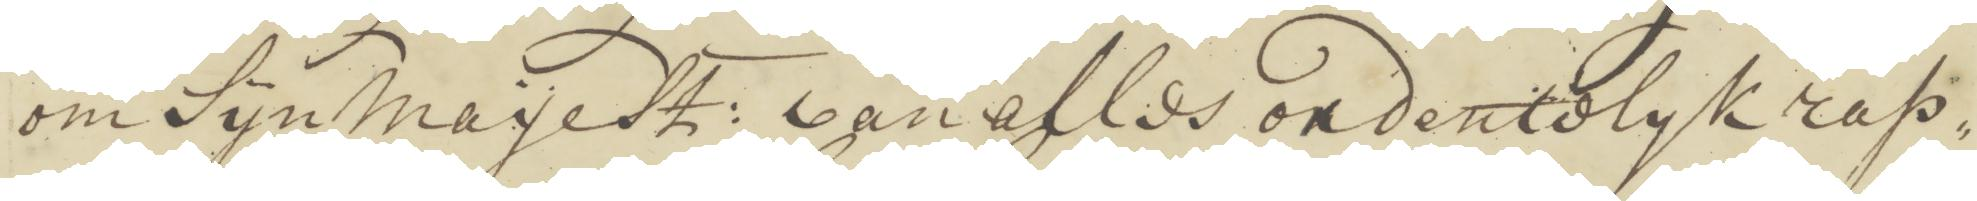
om sijn maijest: van alles ordentelyk rap„
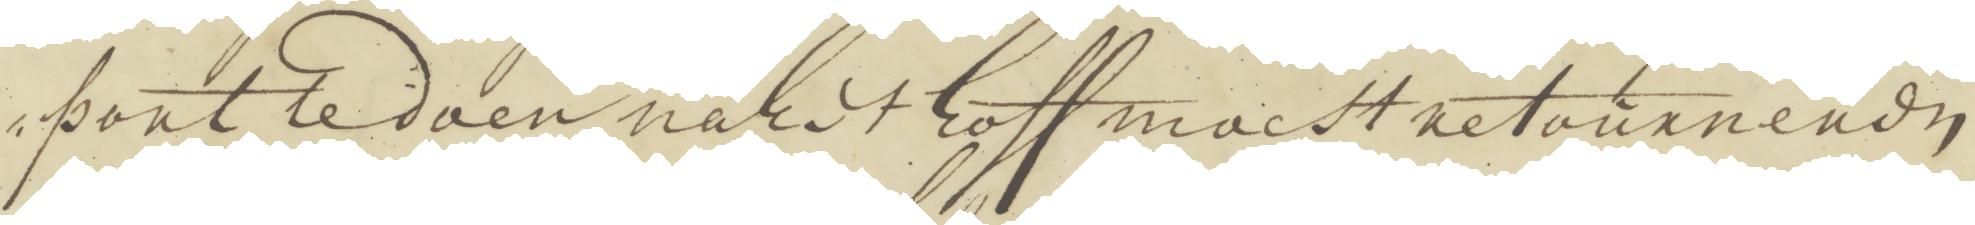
„port te doen na het hoff moest retourneren
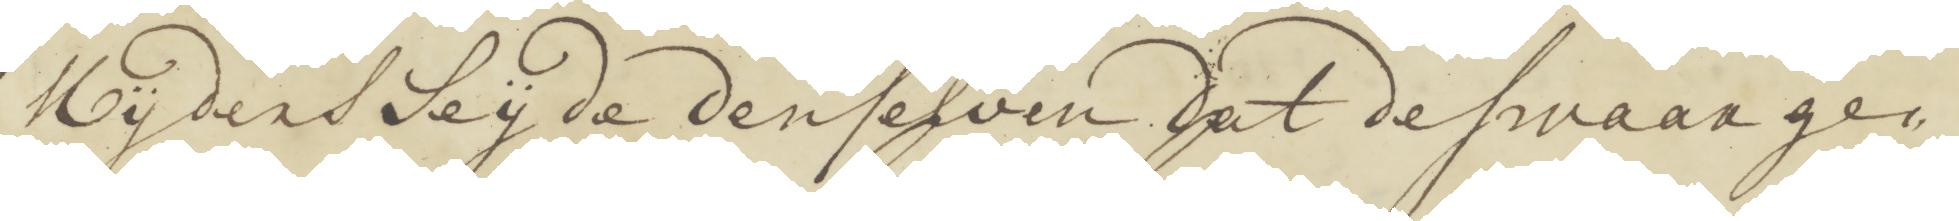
Wijders seijde denselven dat de swaar ge„
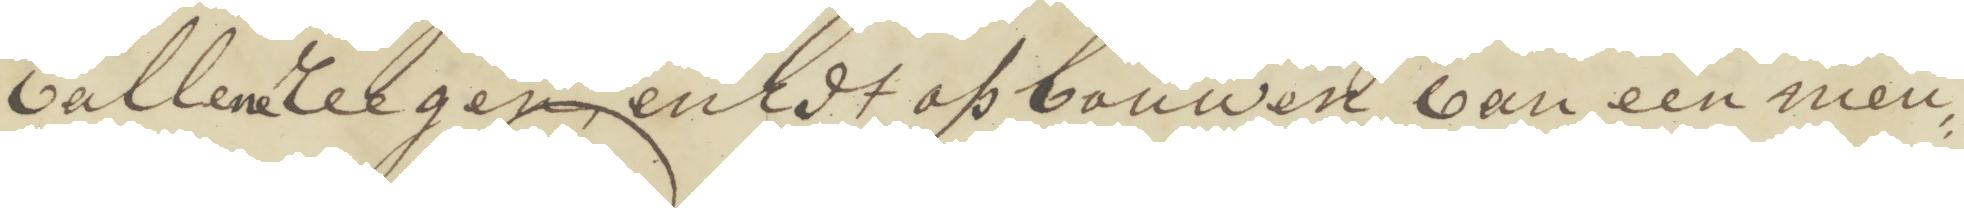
vallene reegen, en het opbouwen van een nieu„
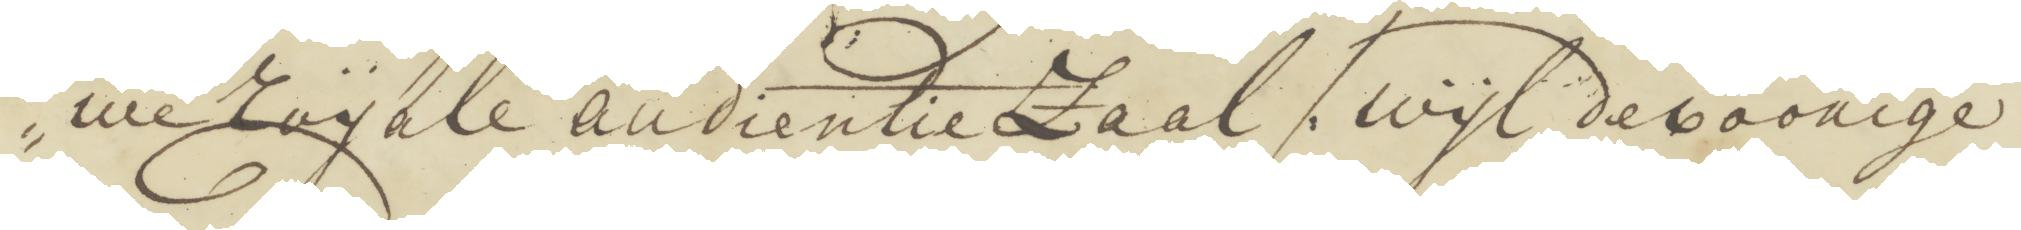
„we roijale audientie zaal /:wijl de voorige
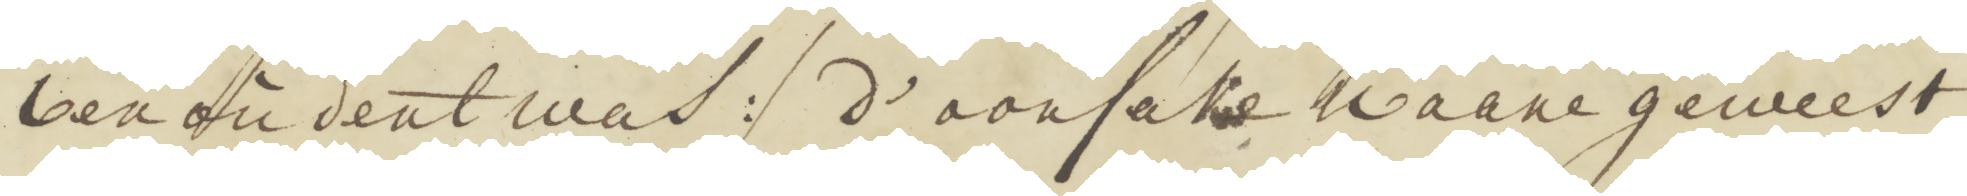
veroudert was :/ d’ oorsake waare geweest
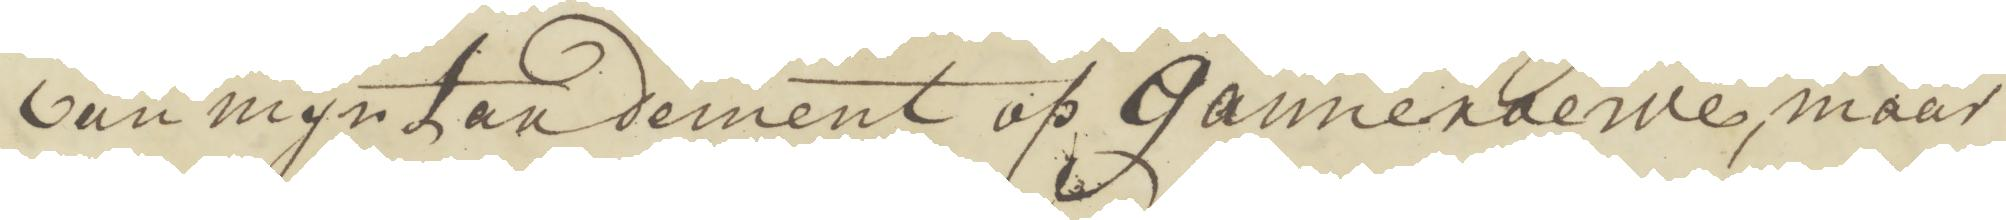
van mijn tardement op Ganneraewe, maar
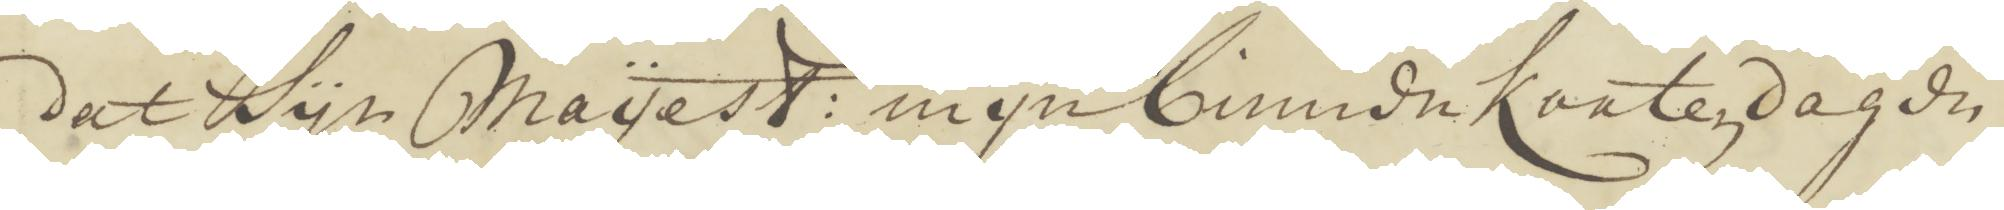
dat sijn maijest:t mijn binnen korten dagen
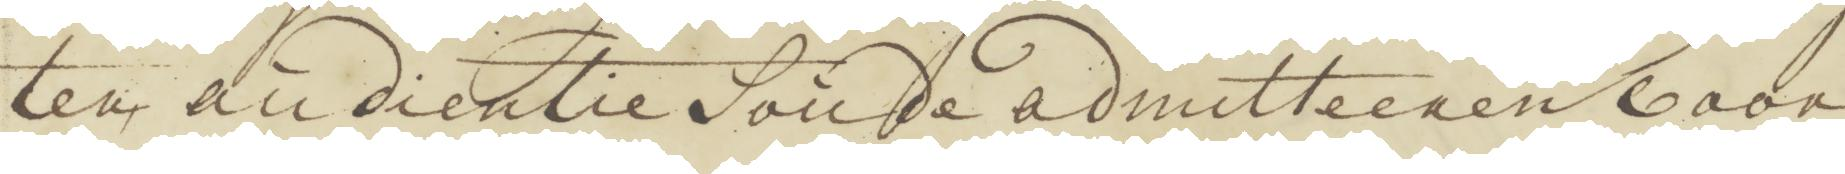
ter audientie soude admitteeren voor
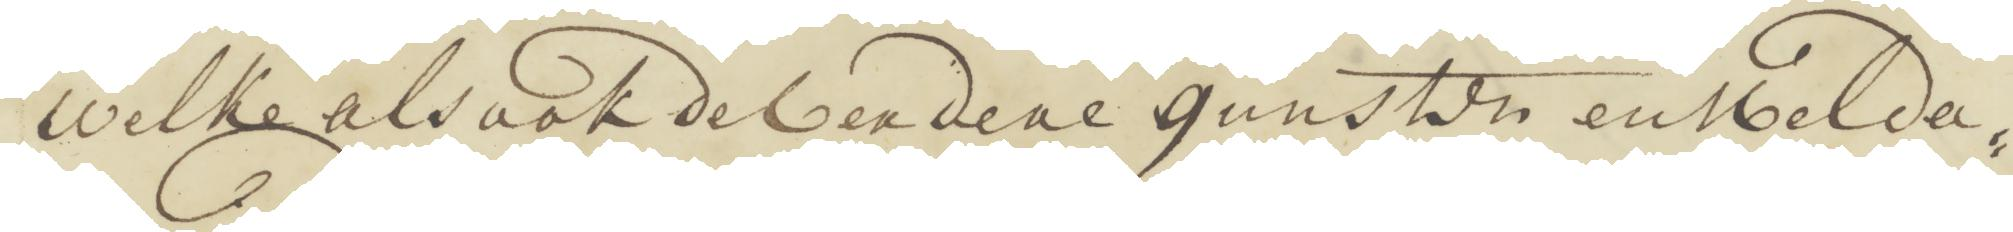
welke als ook de verdere gunsten en welda„
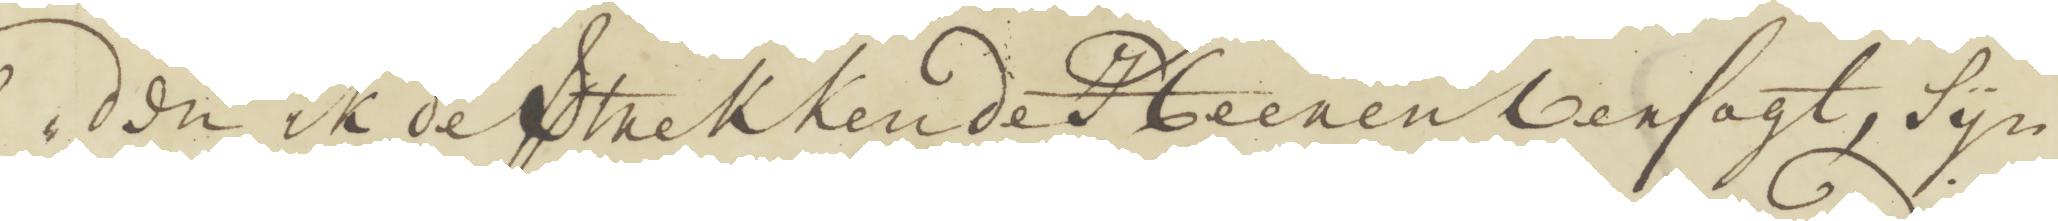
„den, ik de vertrekkende Heeren versogt, sijn
